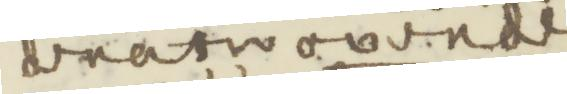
deratie over de
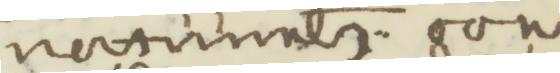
natuurtlijke oor
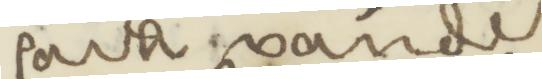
saek van de
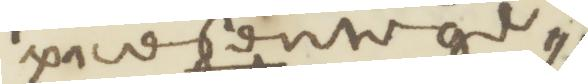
presente ge„
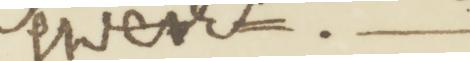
stelth=t.
